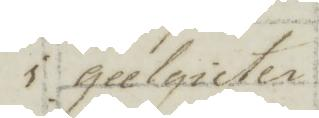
1 geelgieter
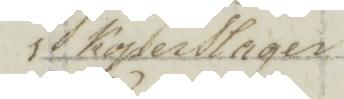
1 Koperslager
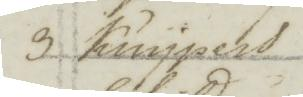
3 Kuijpers
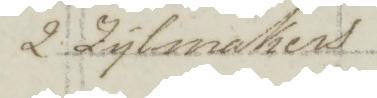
2 Zijlmakers
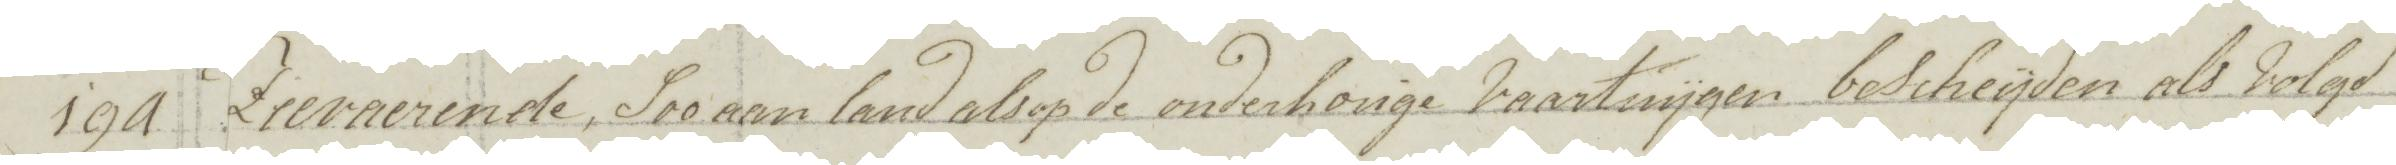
194. Zeevaerende, soo aan land als op de onderhorige vaartuijgen bescheijden als volgd
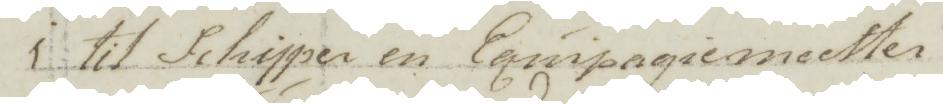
1 til schipper en Equipagie meester
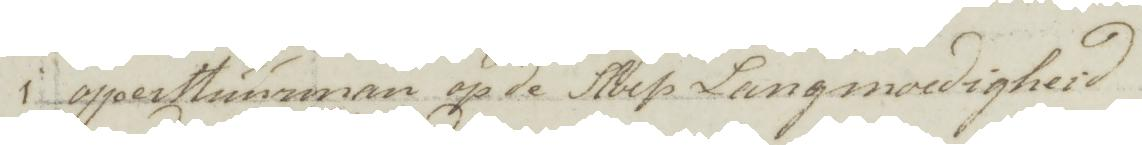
1 opperstuurman op de sloep Langmoedigheid
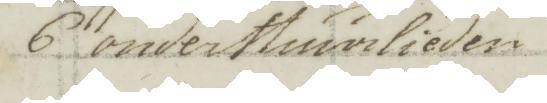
6 onderstuurlieden
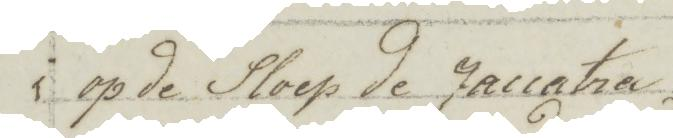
1 op de sloep de Jaccatra
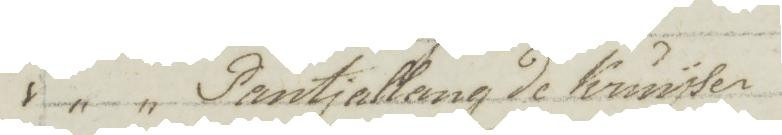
1 „ „ Pantjallang de kruijser
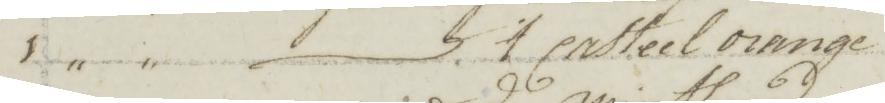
1 „ „ _.o ’t casteel orange
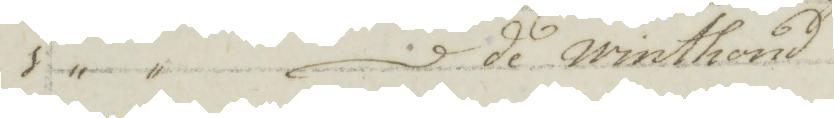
1 „ „ _o de winthond
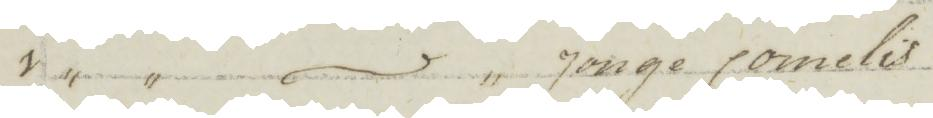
1 „ „ _o „ Jonge cornelis
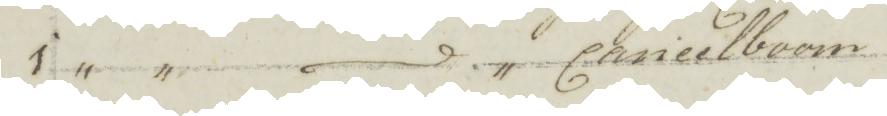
1 „ „ _o „ caneelboom
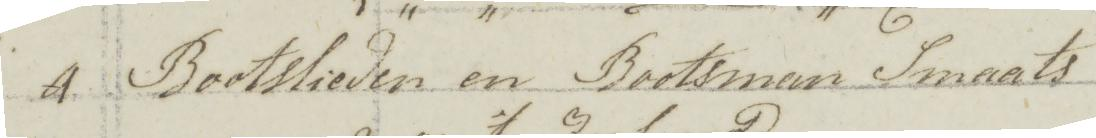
4. Bootslieden en Bootsman smaats
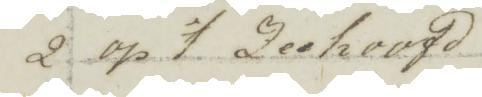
2 op 't Zeehoofd
